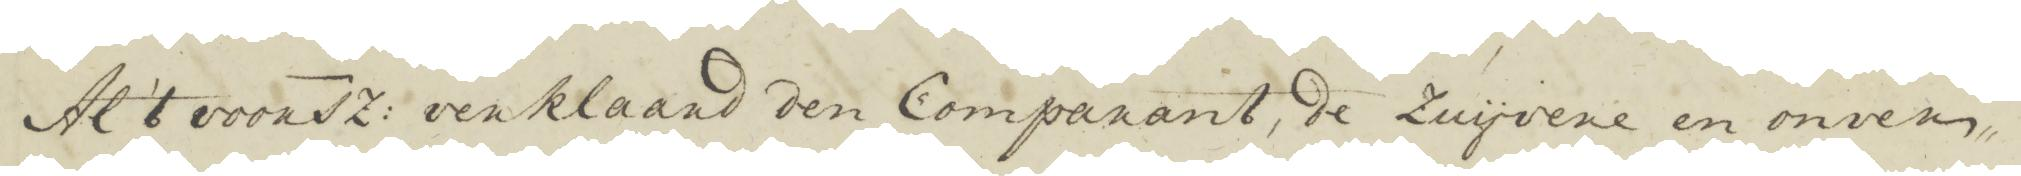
Al 't voorsz: verklaard den Comparant, de Zuijvere en onver„
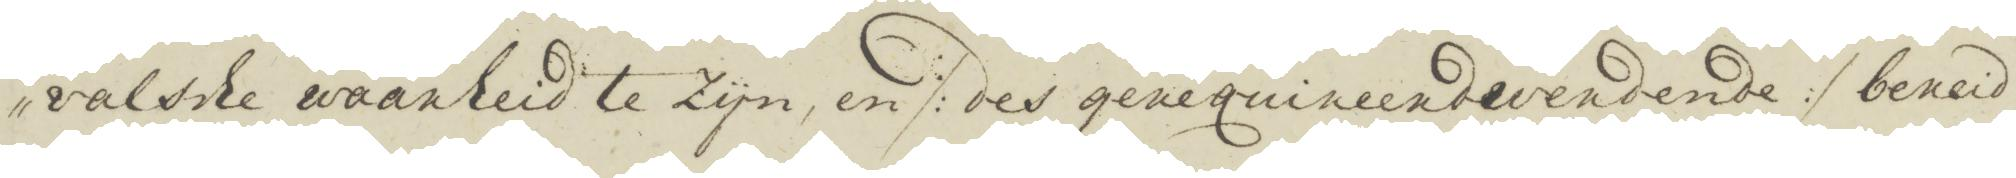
„valsche waarheid te Zijn, en /: des gerequireerd werdende :/ bereid
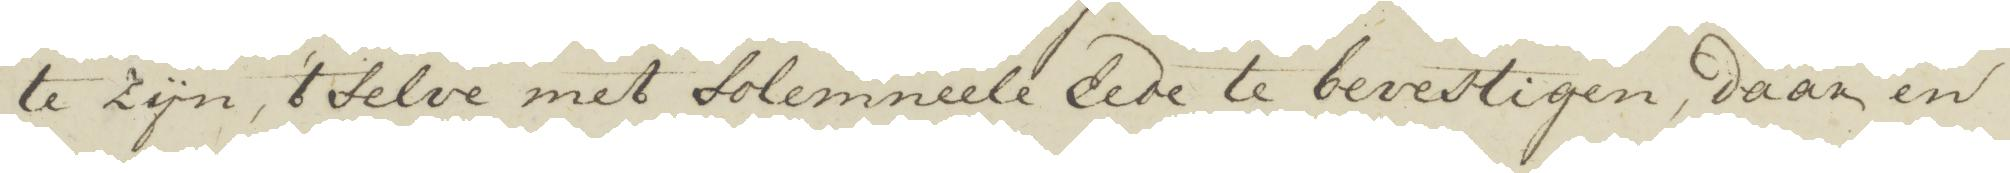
te Zijn, ’t Selve met Solemneele Eede te bevestigen, daar en
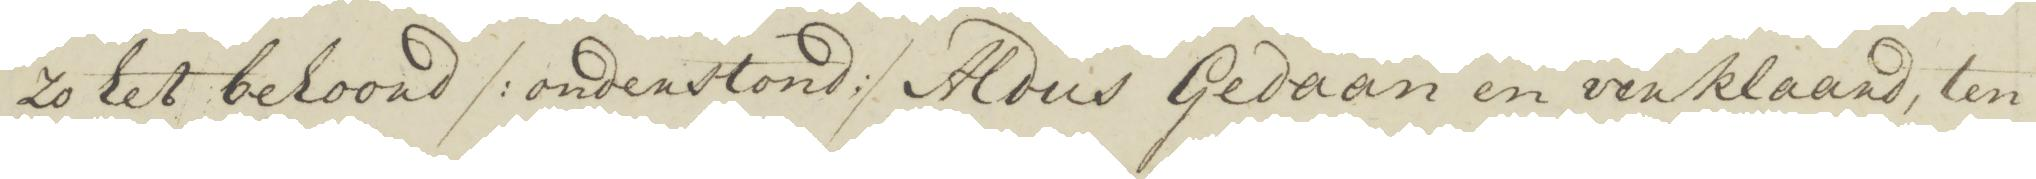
zo het behoord /:onderstond:/ Aldus Gedaan en verklaard, ten
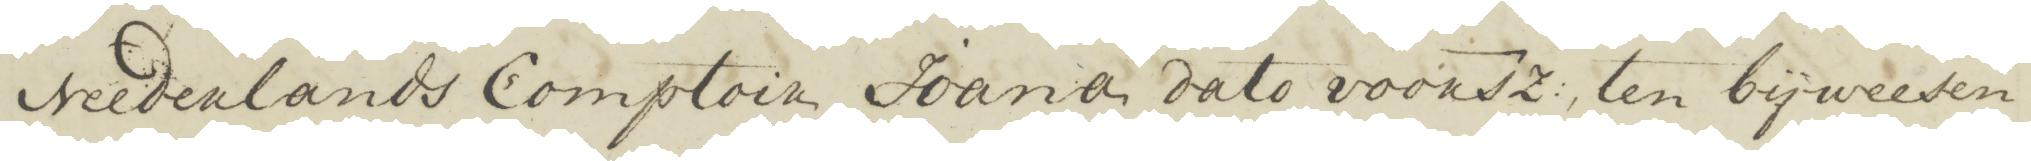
Neederlands Comptoir Ioana dato voorsz:, ten bij weesen
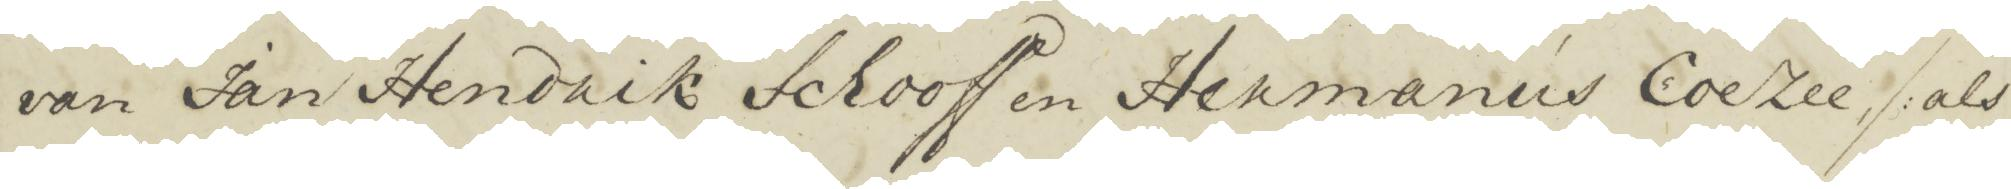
van Ian Hendrik Schooff en Hermanus Coezee, /:als
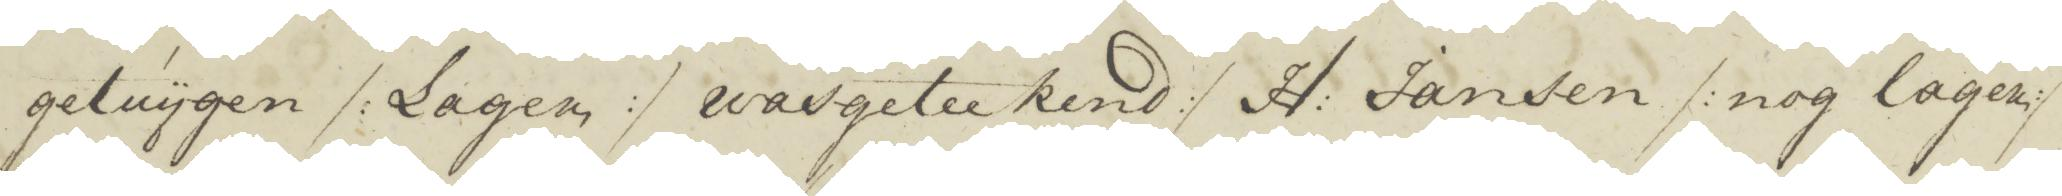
getuijgen /:Lager:/ was geteekend :/ H: Iansen/: nog lager:/
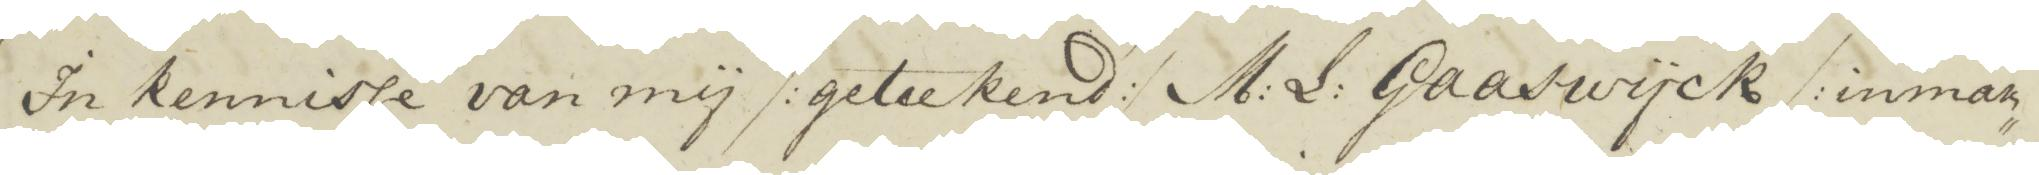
In kennisse van mij /:geteekend:/ M: L: Gaaswijck /:in mar„
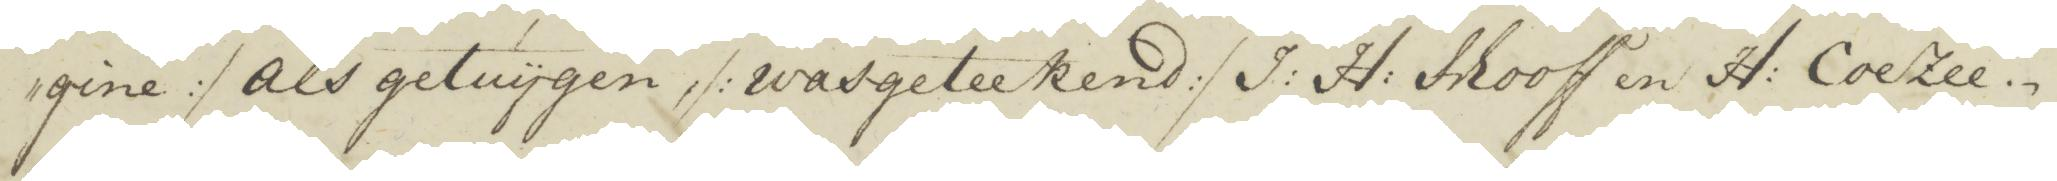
„gine :/ als getuijgen /:was geteekend:/ I: H: Schooff en H: Coezee.
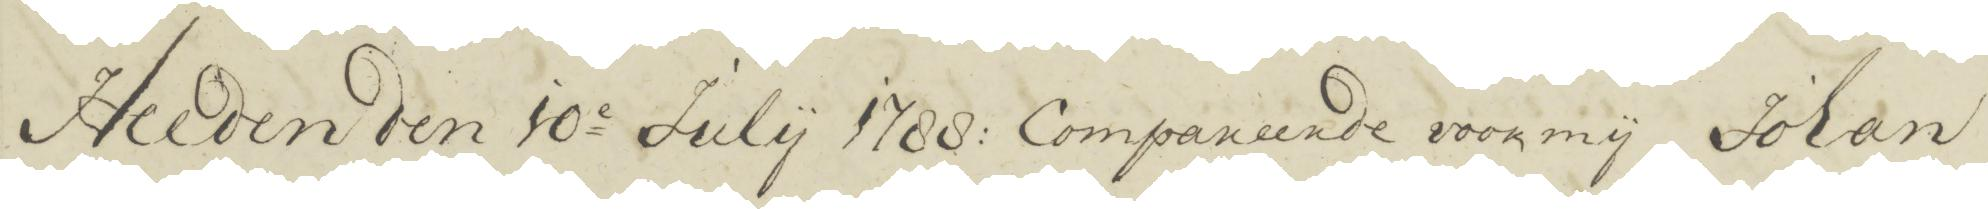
Heeden den 10=e Iulij 1788: Compareerde voor mij Iohan
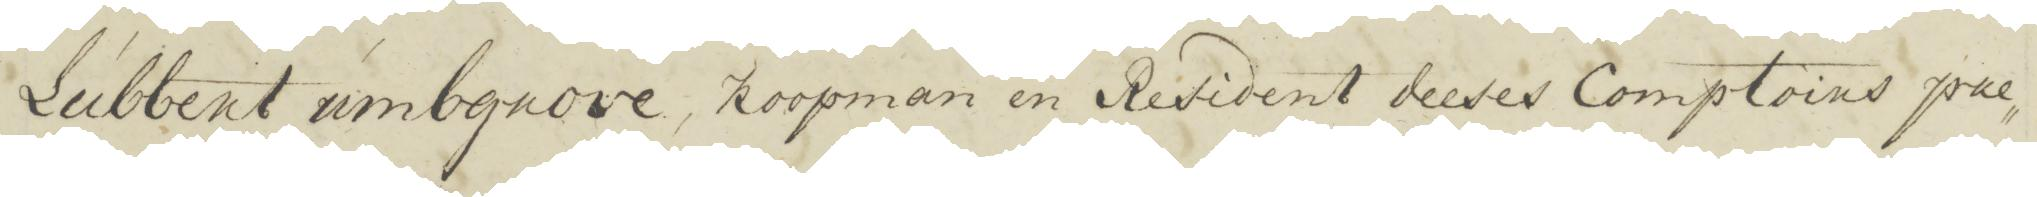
Lubbert umbgrove, koopman en Resident deeses Comptoirs pre„
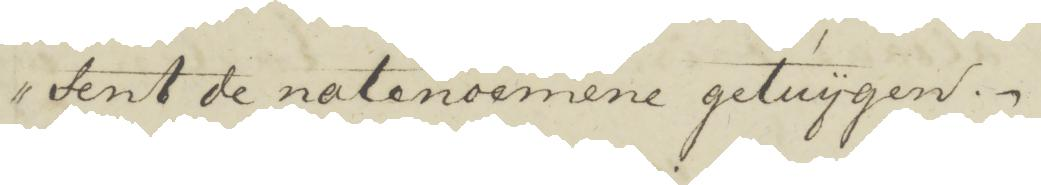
„sent de natenoemene getuijgen.-
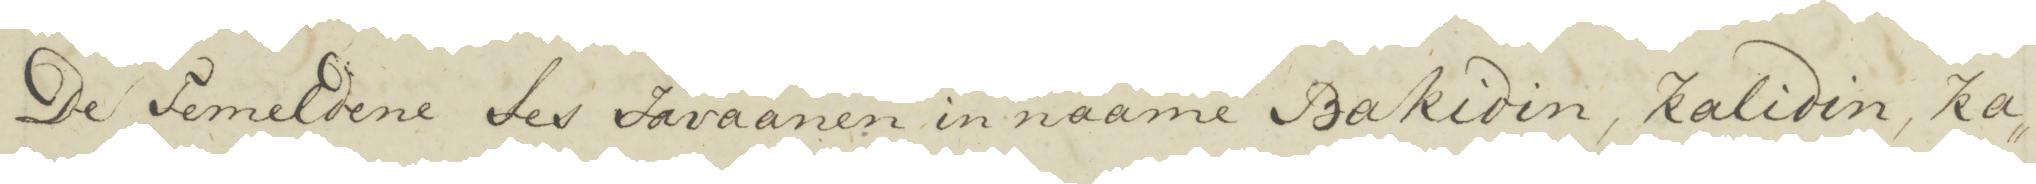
De Te meldene Ses Iavaanen in naame Bakidin, Kalidin, Ka„
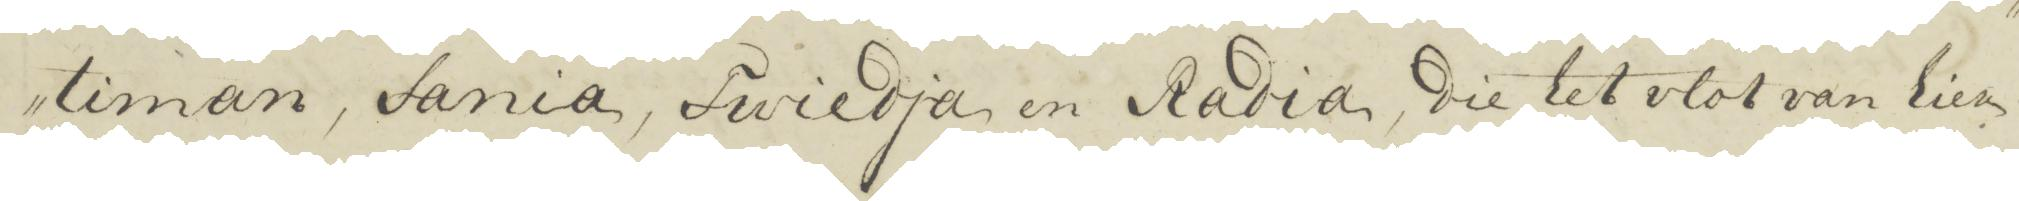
„timan, Sania, Twiedja en Radia, die het vlot van hier
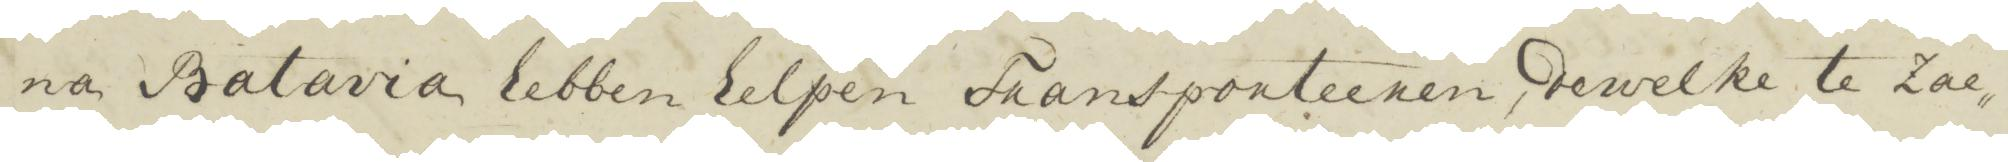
na Batavia hebben helpen Transporteeren, dewelke te Zae„
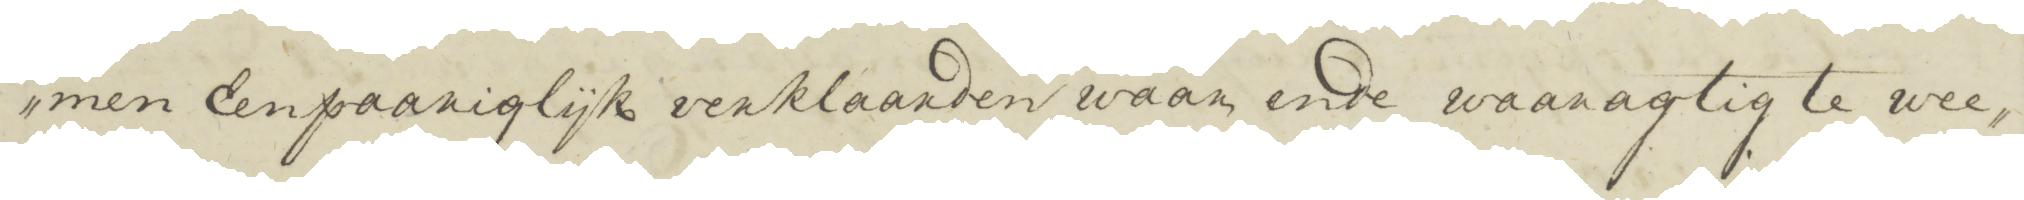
„men Een paariglijk verklaarden waar ende waaragtig te wee„
